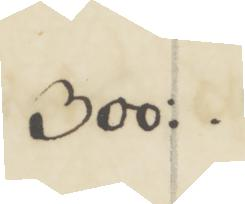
300: .
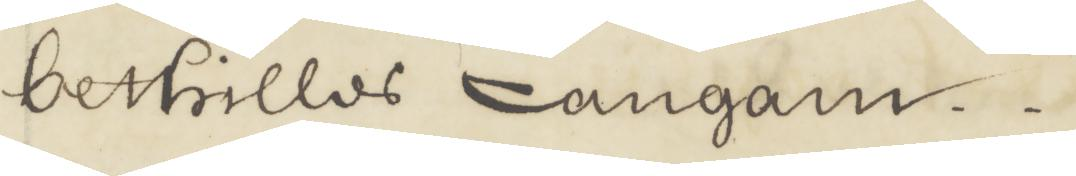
bethilles cangam . -
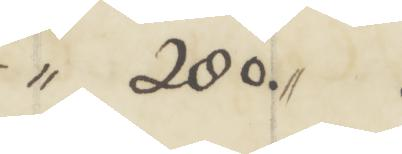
„ 280.„
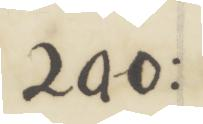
240:
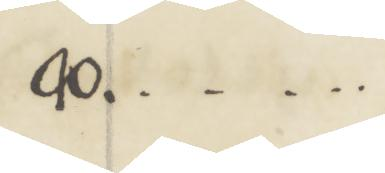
40. . - . . .
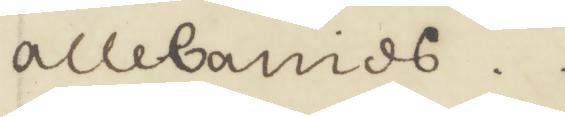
allebanies .
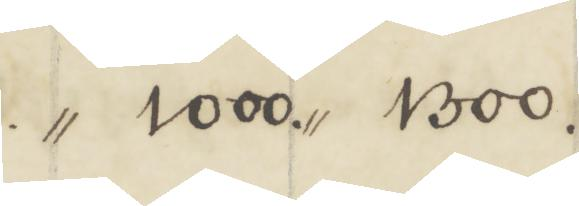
„ 1000.„ 1300
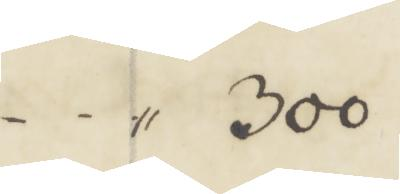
- - .„ 300
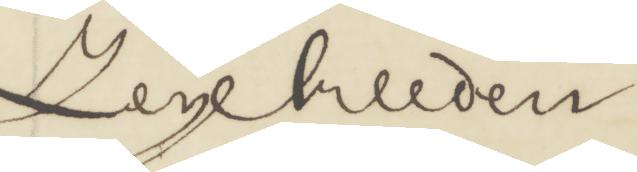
Zeijlkleden
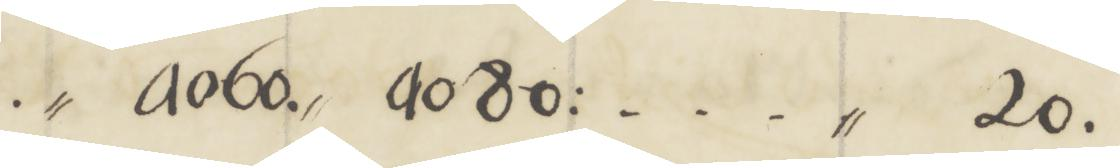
. „ 4060.„ 4080: - - - „ 20.
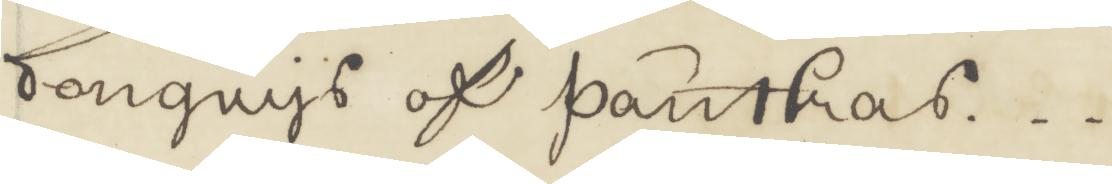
dongrijs of pautkas. - -
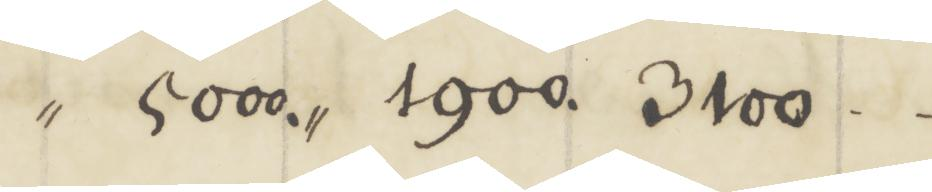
„ 5000.„ 1900. 3100 -
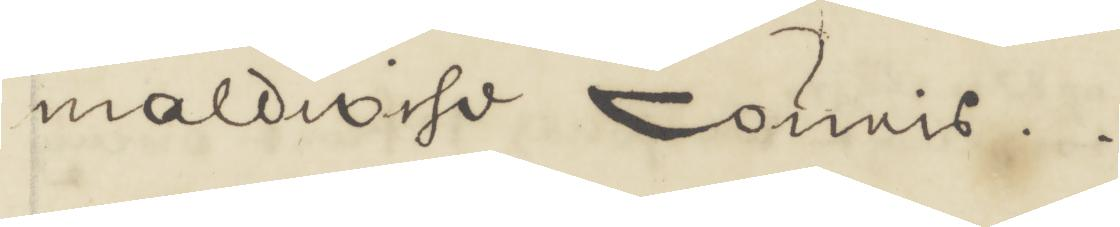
maldivise Couris . .
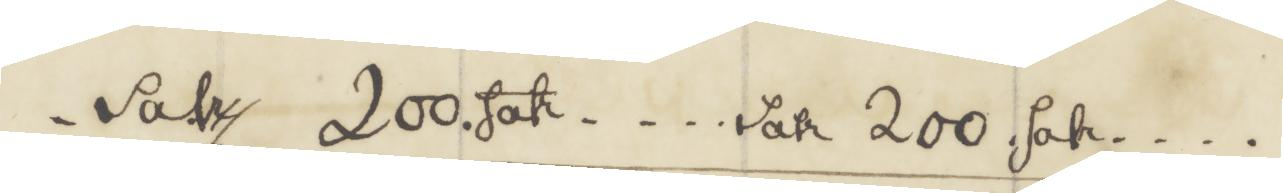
- sak„ 200. sak - - - . sak 200. sak . . . .
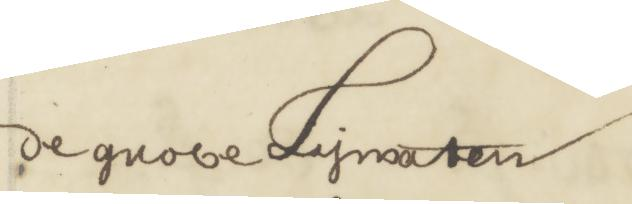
de grove Lijwaten
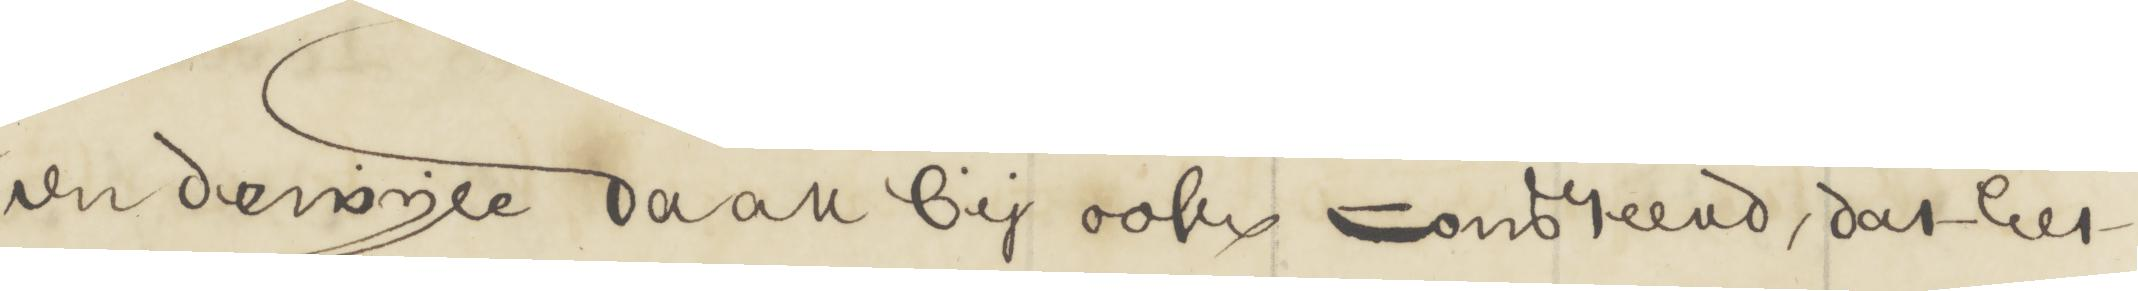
en dewijle daar bij ook consteerd, dat het
